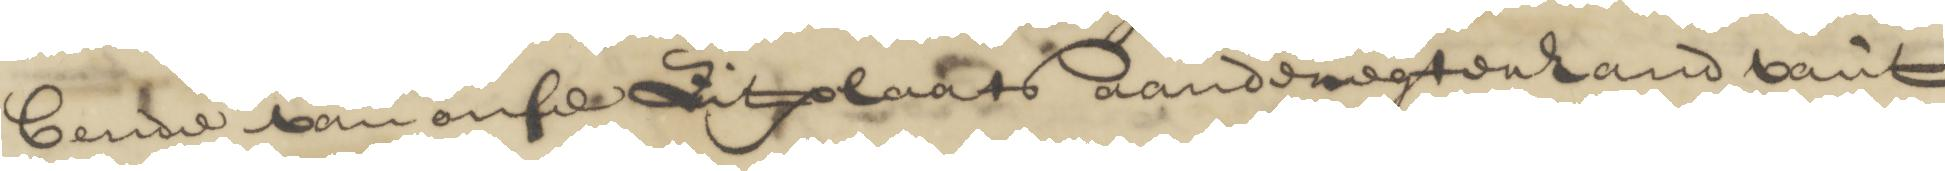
bende van onse zitplaats aande regterhand van't
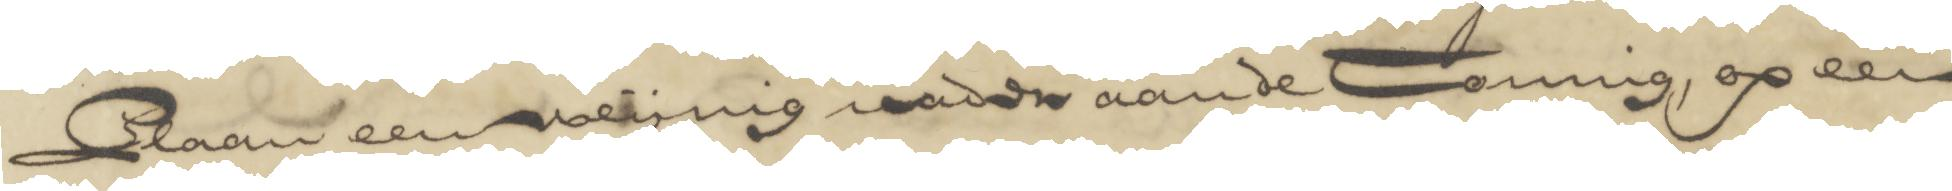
Plaan een weijnig nader aan de Coning, op een
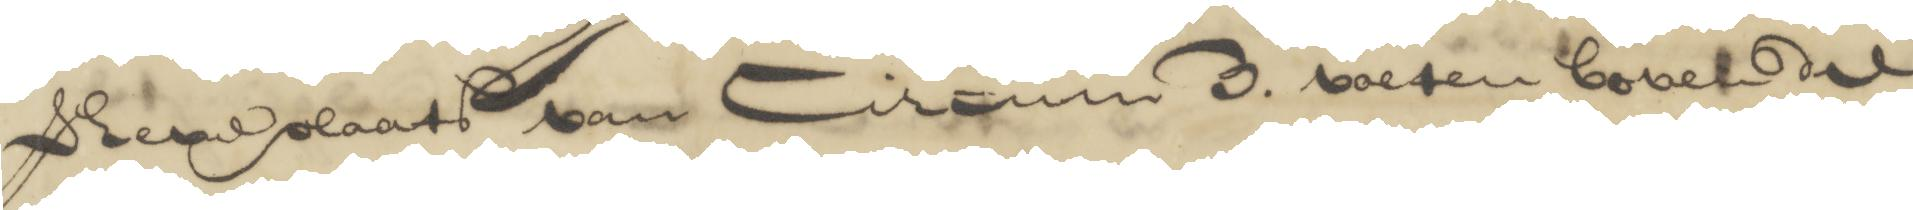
verheve plaats van Circum 3. voeten boven de
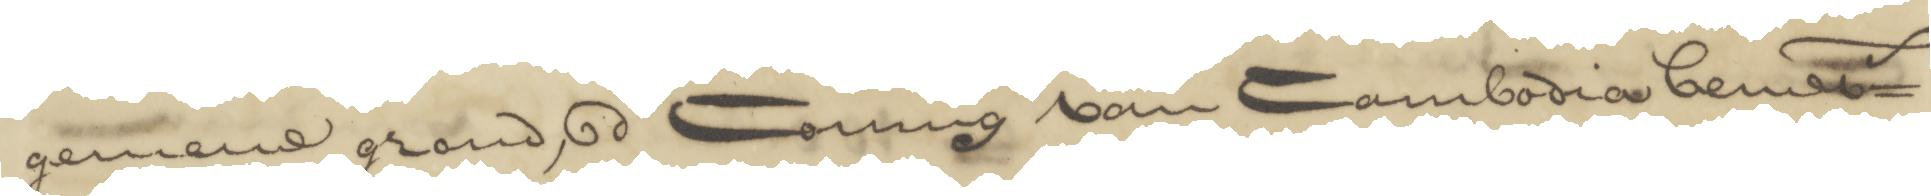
gemene grond, d' Coning van Cambodia benev=s
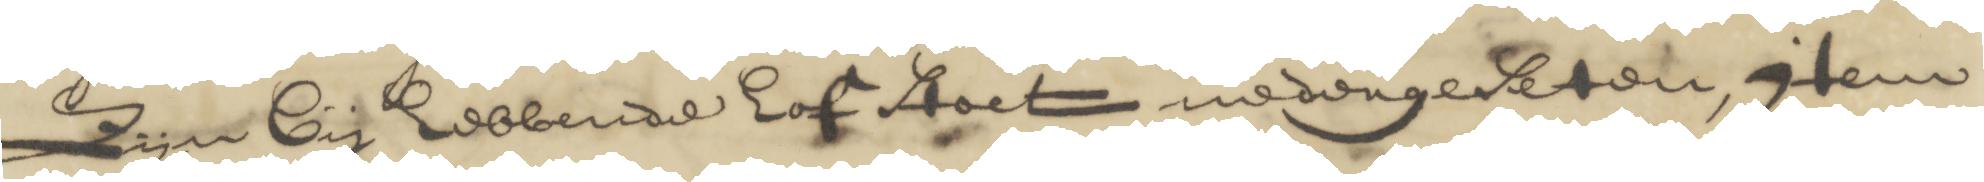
zijn bij hebbende hof stoet nedergeseten, item
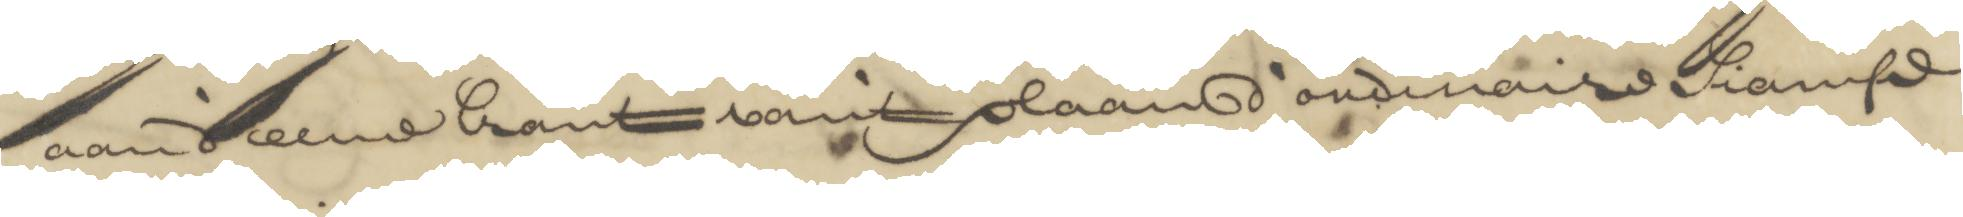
aan d' eene kant van 't plaan d'ordinaire Siamse
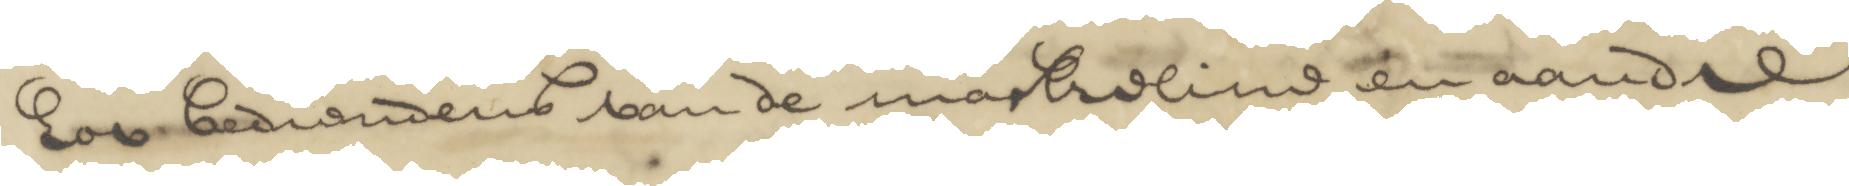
hov bediendens van de maskeline en aande
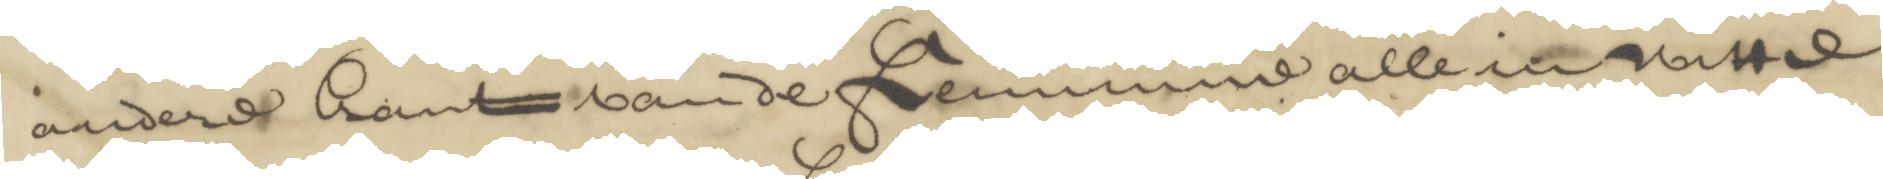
andere kant van de feminine alle in witte
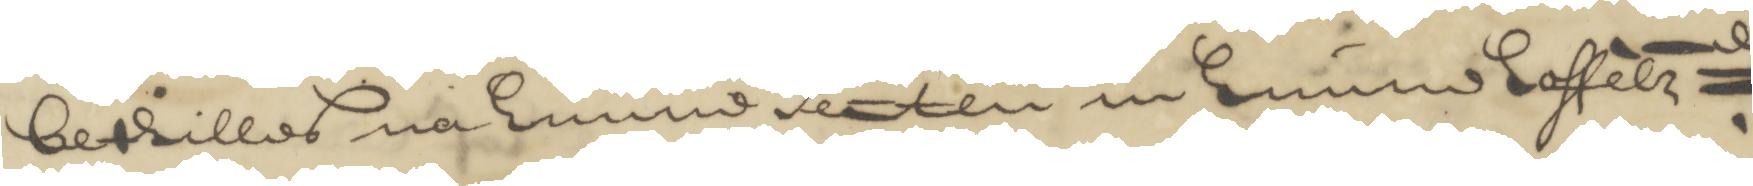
bethilles na hunne secten in hunne hoffelijk=e
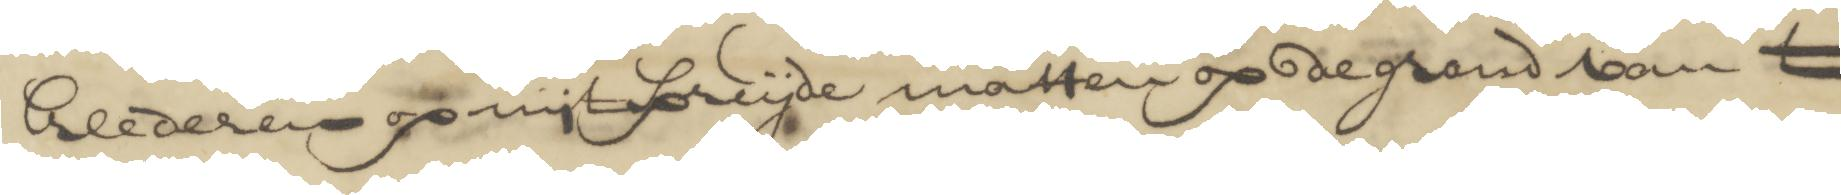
klederen op uijtspreijde matten op de grond van 't
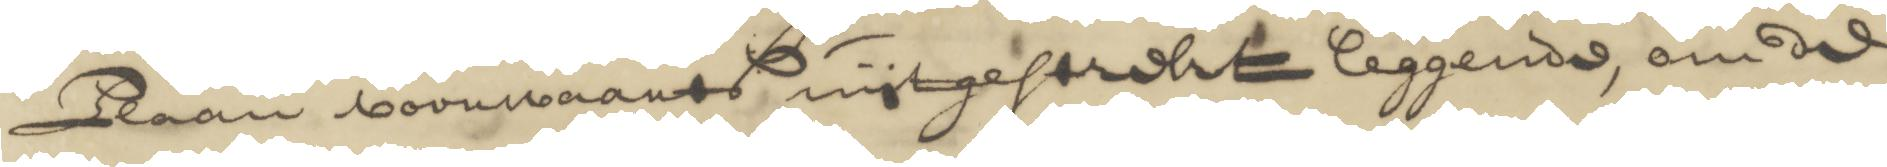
Plaan voorwaarts uijtgestrekt leggende, om de
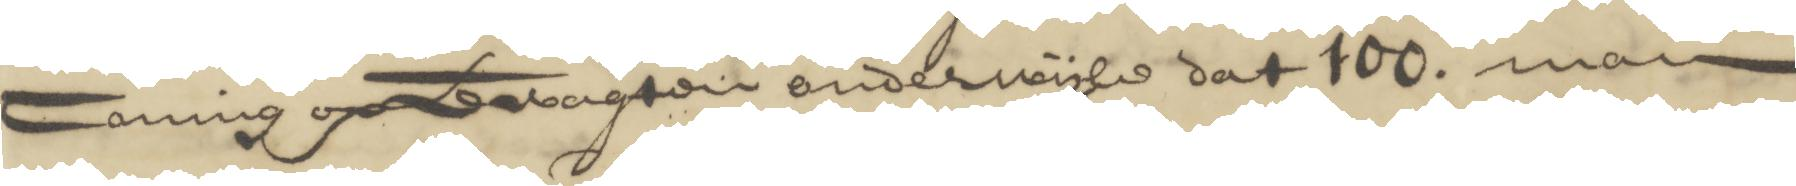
Coning op te wagten onderwijle dat 100. man
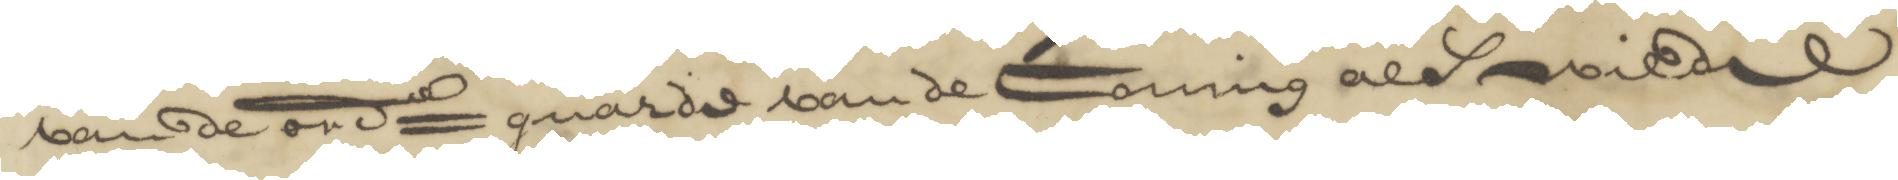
van de ord=e guarde van de Coning als wilde
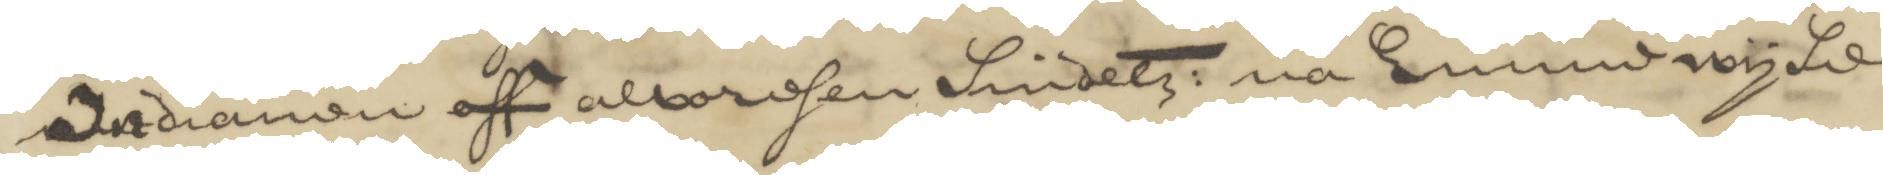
Indianen off alvoresen sindelijk na hunne wijse
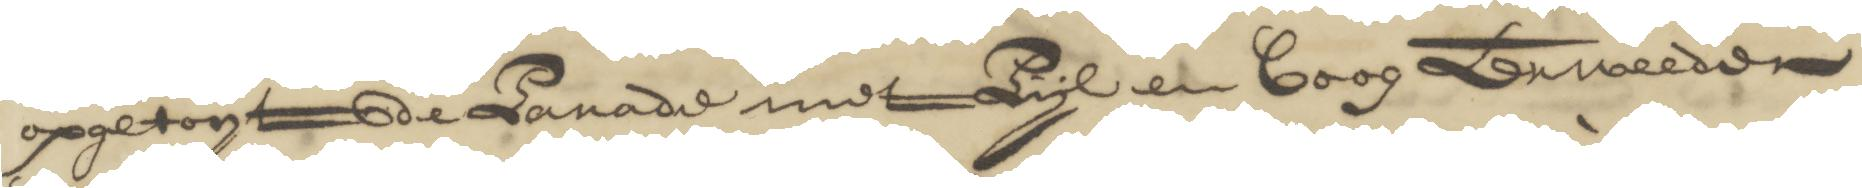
opgetoijt de Parade met Pijl en boog terweeder
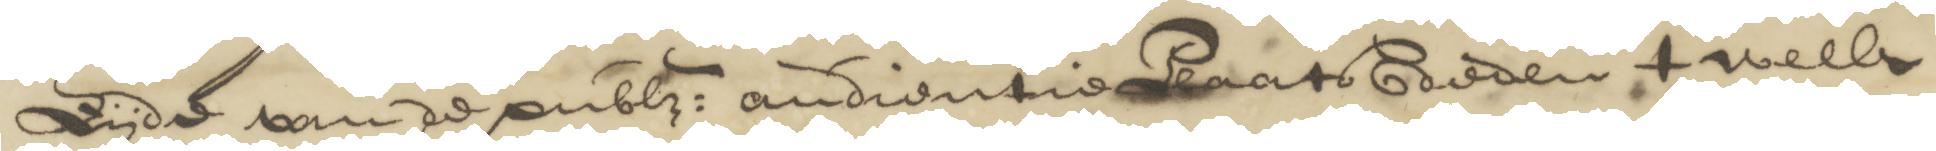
zijde van de publijk audientie Plaats deden 't welk
